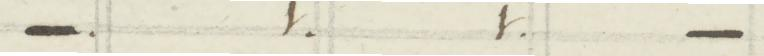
—. 1. 1. —
